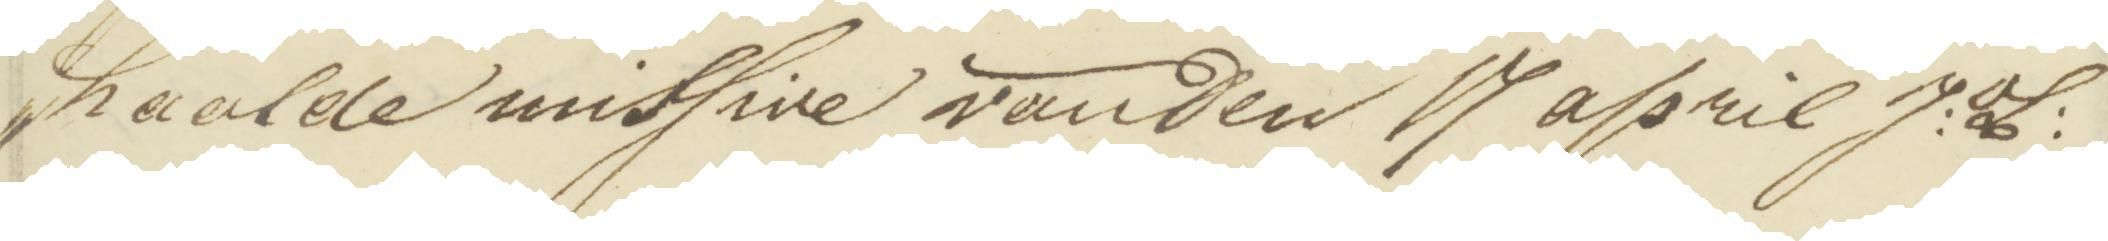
„haalde missive van den 17 april J:o L:
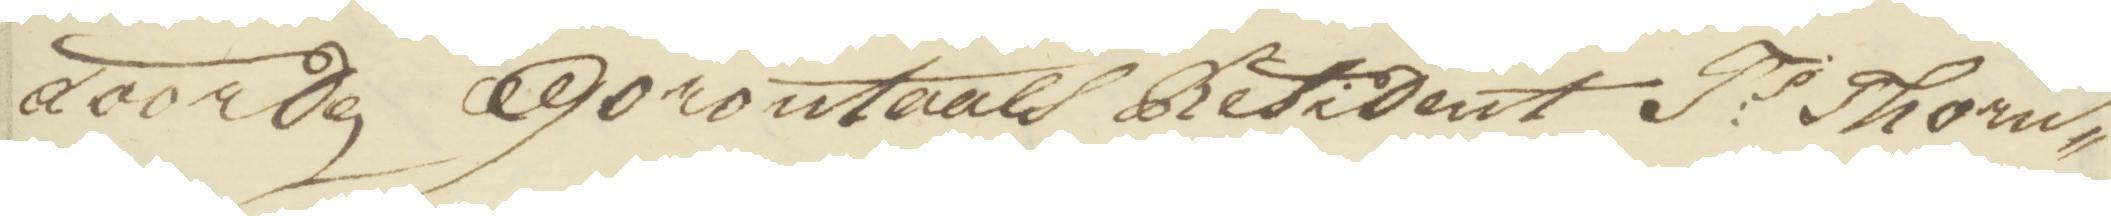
door den Gorontaals Resident T:s Thorn„
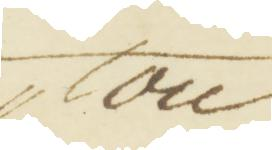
„ton
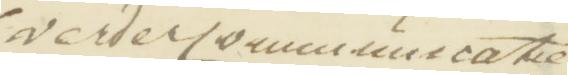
verder communicatie
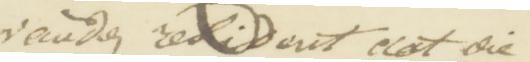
van den resident dat die
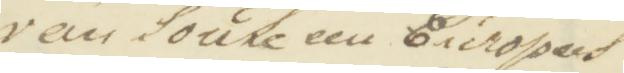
van souse een Europees
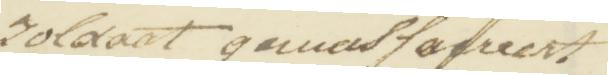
zoldaat gemassacreert
